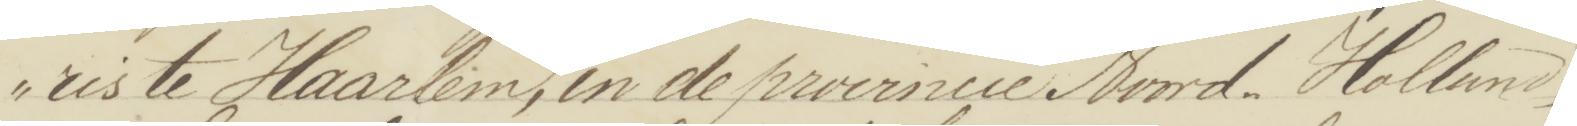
„ris te Haarlem, in de provincie Noord- Holland,
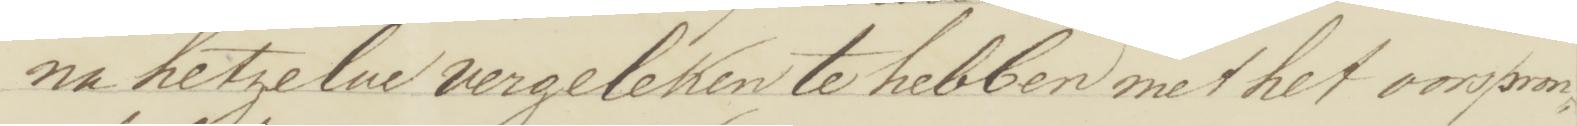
na hetzelve vergeleken te hebben met het oorspron„
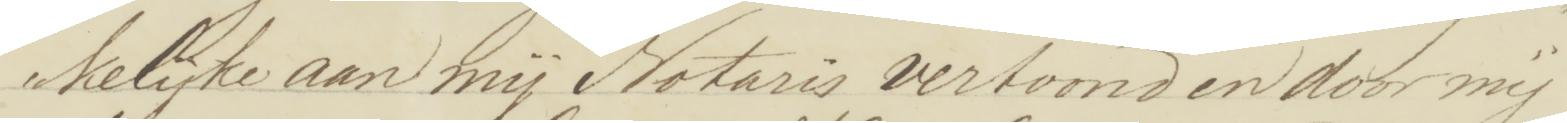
„kelijke aan mij Notaris vertoond en door mij
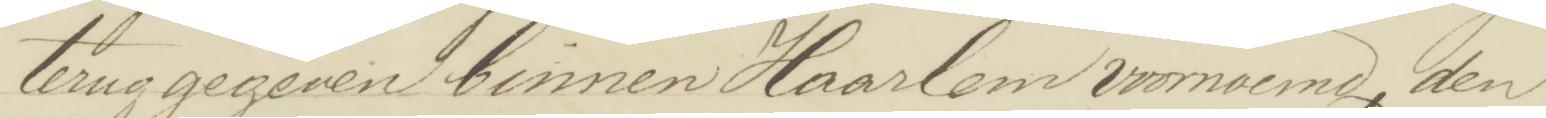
terug gegeven binnen Haarlem voornoemd, den
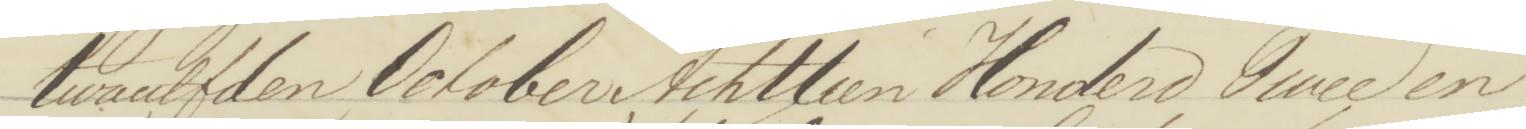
twaalfden October Achttien Honderd Twee en
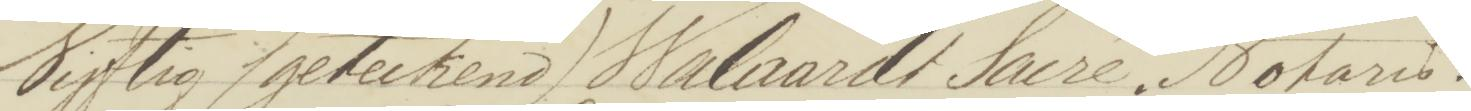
Vijftig (geteekend) Walaardt Sacré, Notaris.
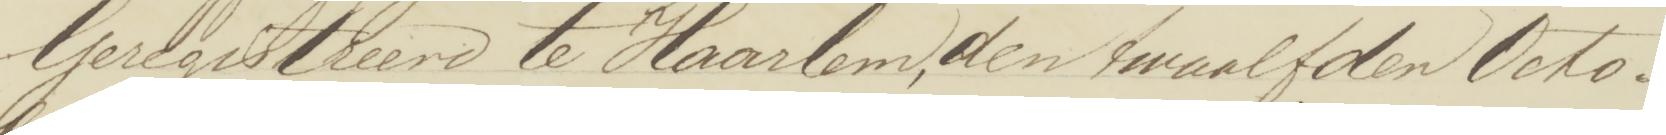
Geregistreerd te Haarlem, den twaalfden Octo„
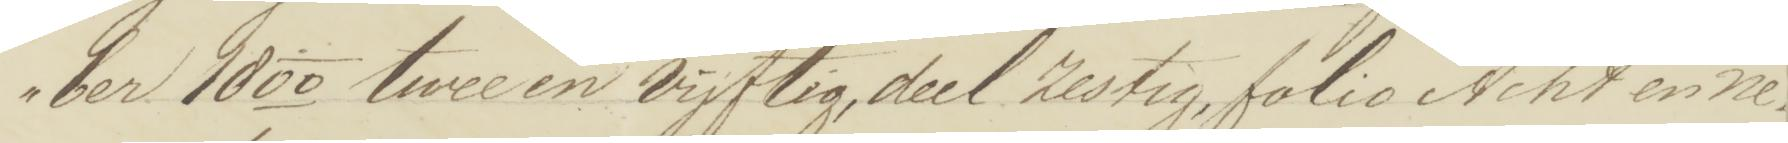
„ber 1800 twee en Vijftig, deel zestig, folio Acht en ne„
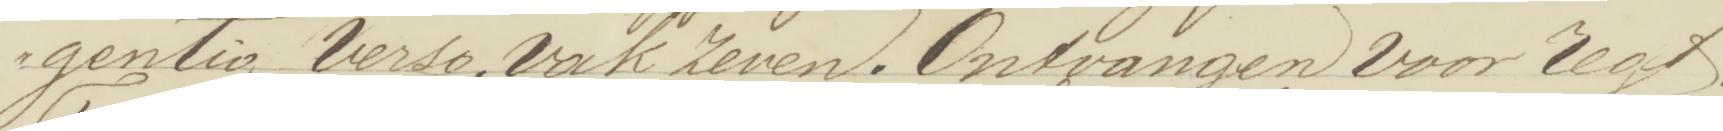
„gentig verso, vak zeven, Ontvangen voor Regt
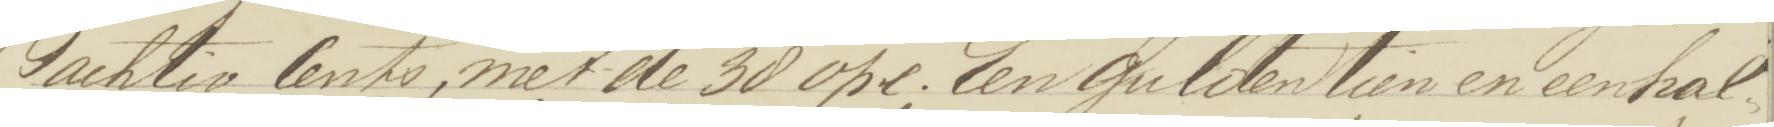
Tachtig Cents, met de 38 opc. Een Gulden tien en een hal„
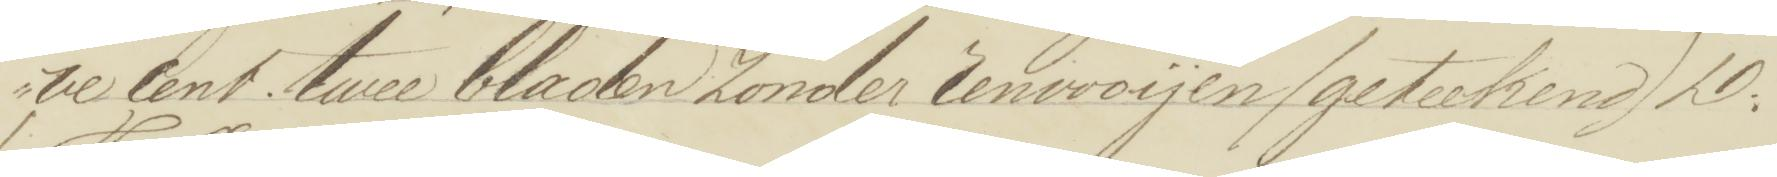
„ve Cent. twee bladen zonder Renvooijen (geteekend) D:
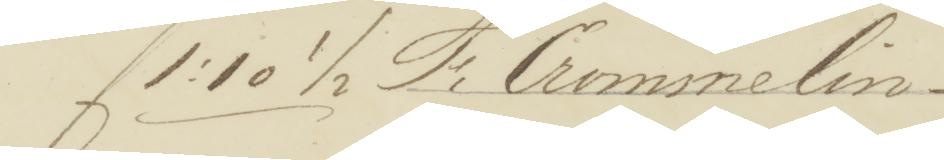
ƒ1:10½ F. Crommelin —
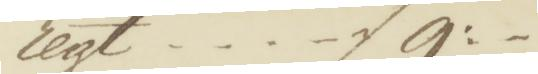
regt - - - - ƒ 9: —
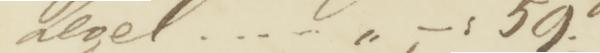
Zegel - - - - „ —: 59.
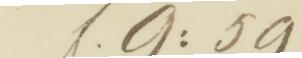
ƒ. 9: 59
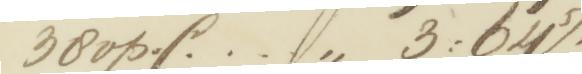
38op.C. - - - „ 3: 64 5/
